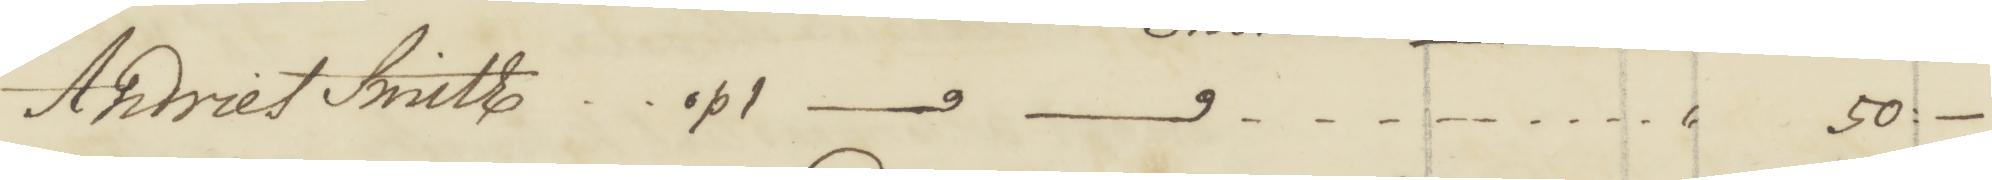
Andries Smith . . op 1 _o _o . . . . . . . . . „ 50: —
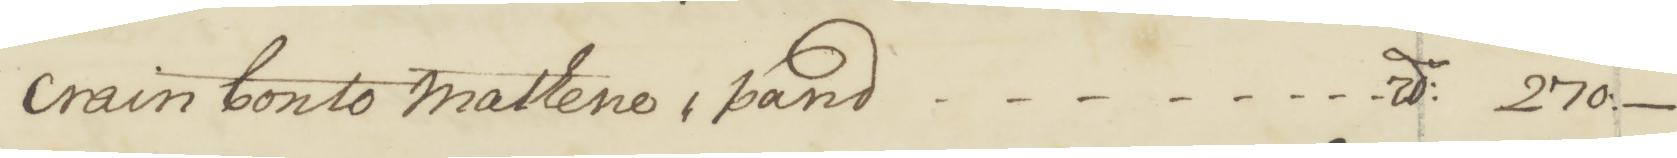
crain bonto mathene 1 pand . . . . . . . . rd:s 270: —
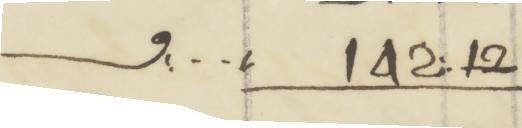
_„o . . „ 142: 12
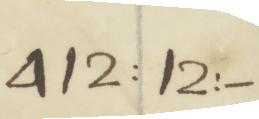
412: 12:—
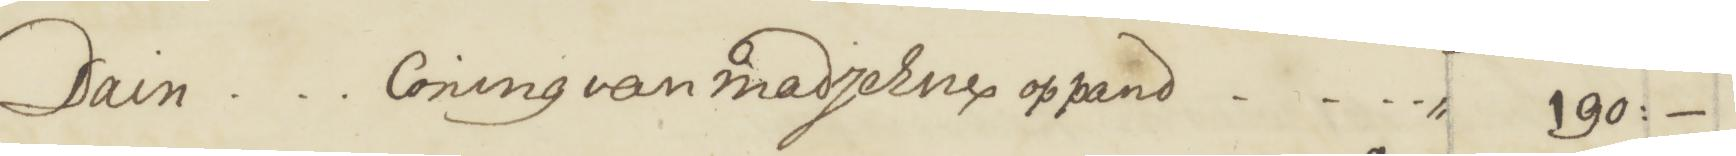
Dain . . . Coning van madjehne op pand . . . . „ 190: —
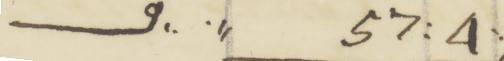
_„o . „ 57: 4:
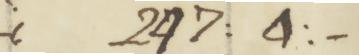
„247: 4: —
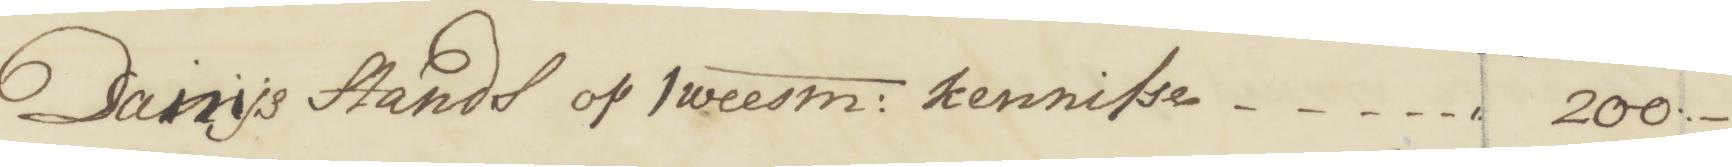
Danijs stands op 1 weesm: kennisse . . . . . „ 200: —
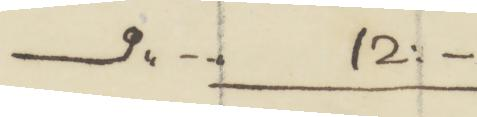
_„o . „ 12: —
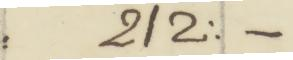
„ 212: —
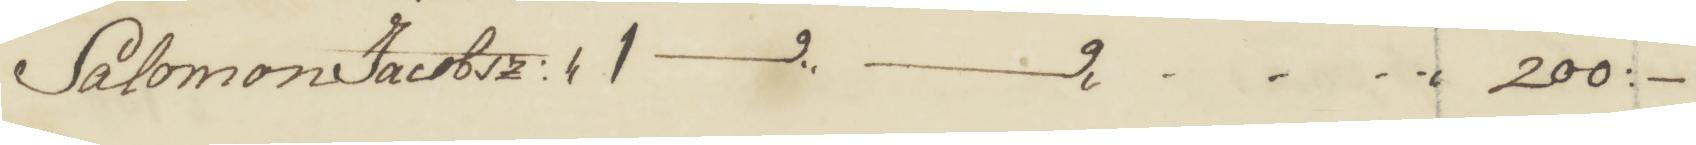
Salomon Jacobsz: „ 1 _„o _„o . . . . „ 200: —
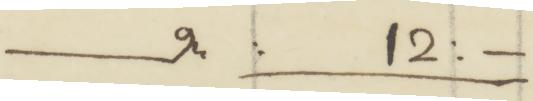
_„o „ 12: —
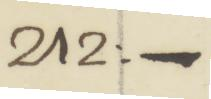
212: —
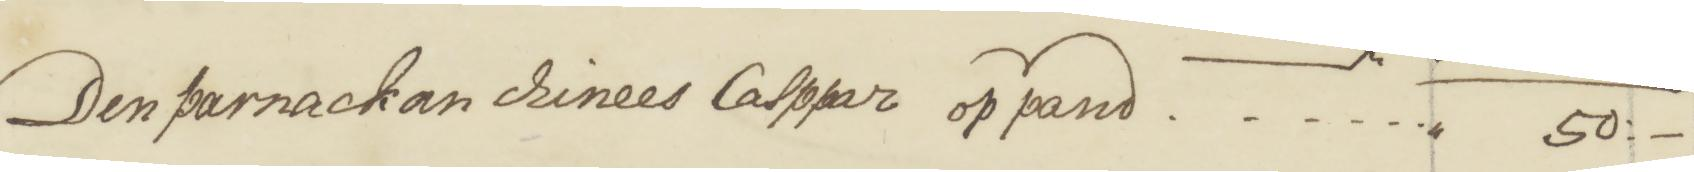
Den parnackan chinees Casppar op pand . . . . . . „ 50: —
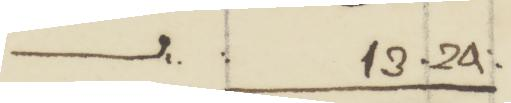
_„o „ 13: 24:
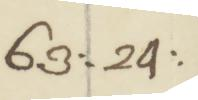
63: 24:
